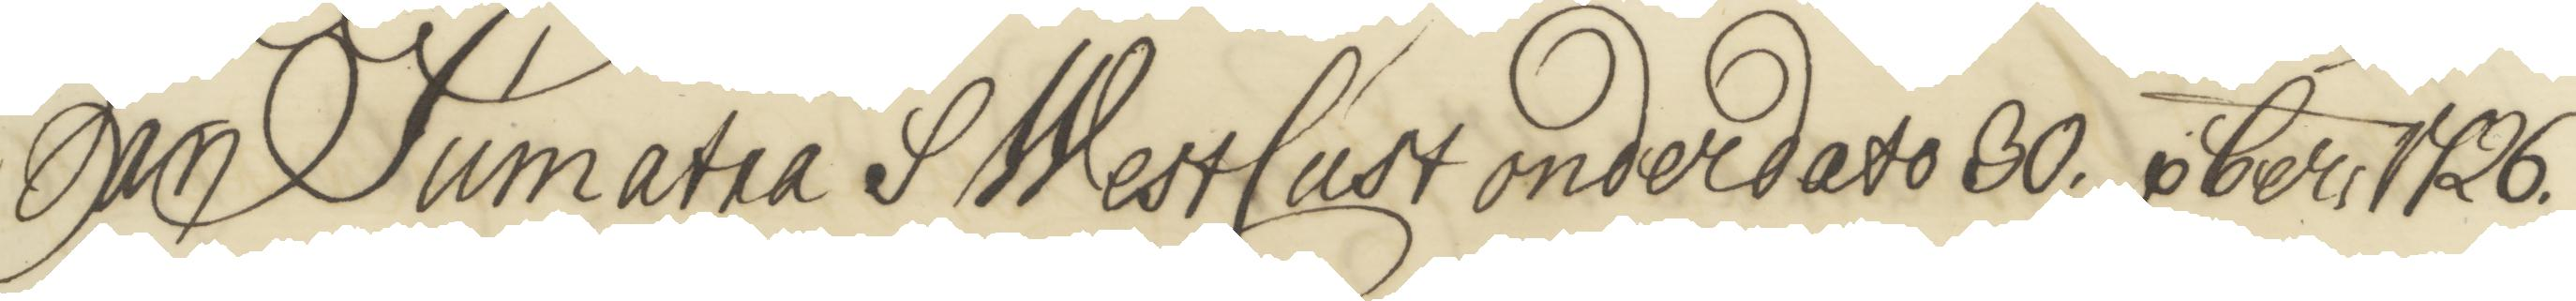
Van Sumatra 's West Cust onder dato 30: xber 1726.
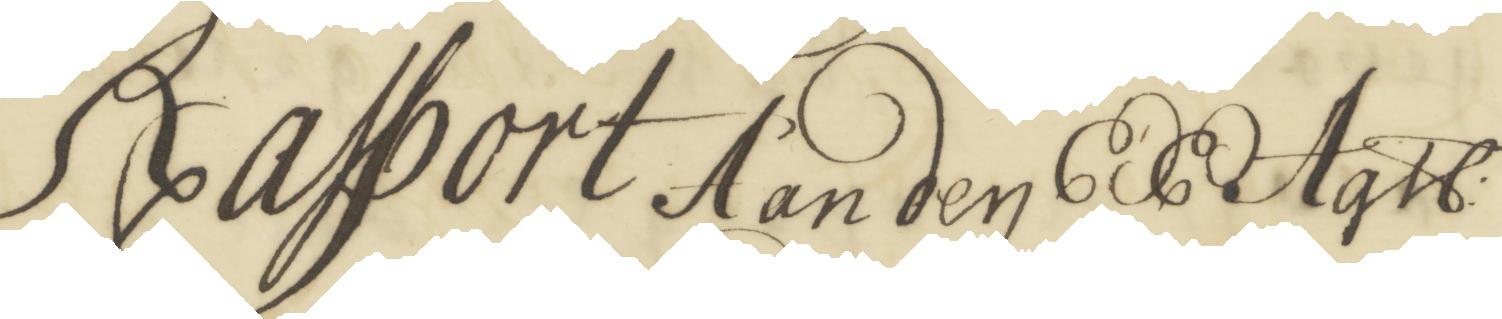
Rapport Aan den EE Agtb:
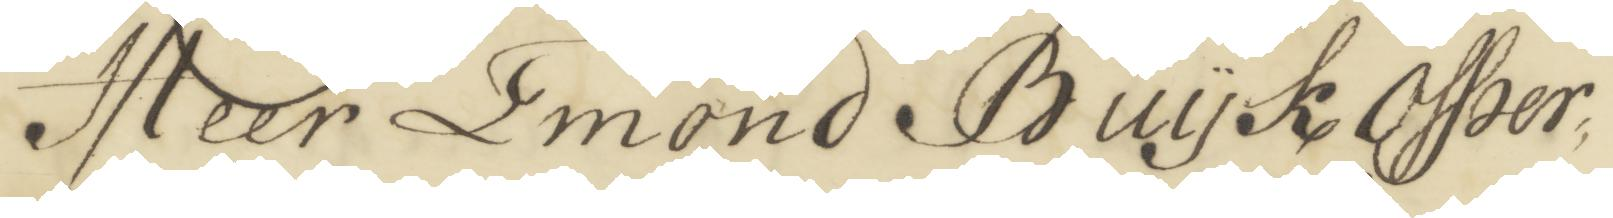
Heer Emond Buijk opper„
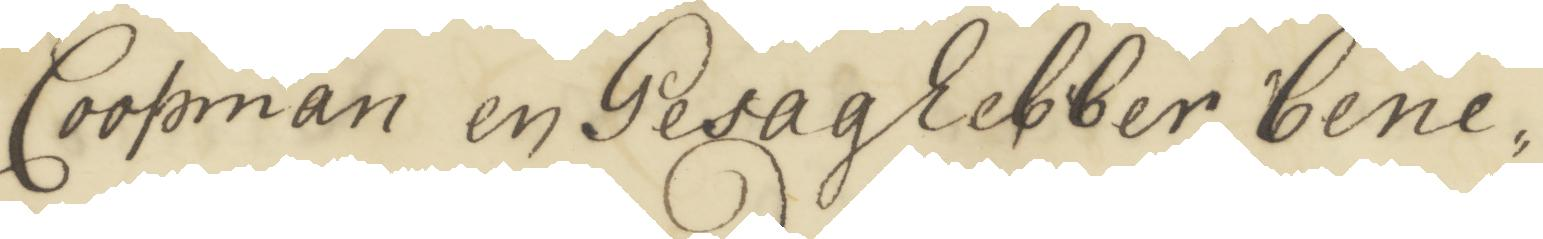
Coopman en Gesaghebber, bene„
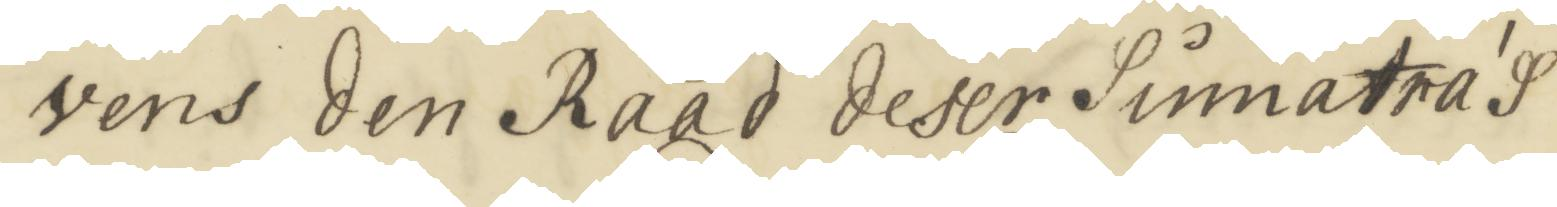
vens den Raad deser Sumatra's
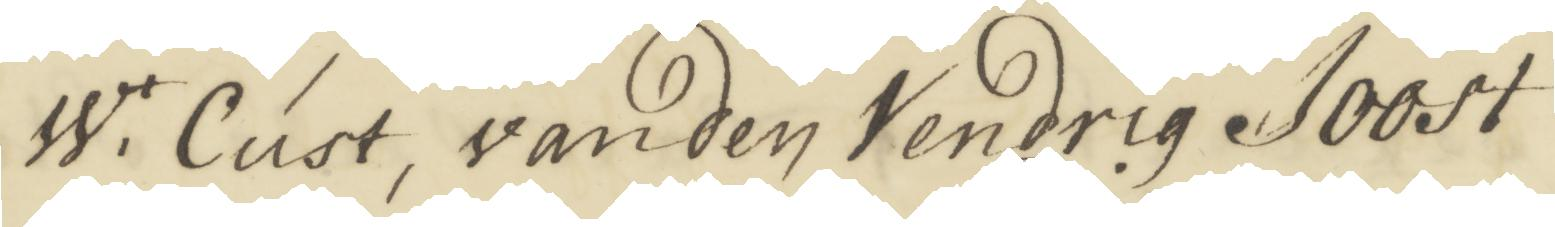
W.t Cust, van den Vendrig Joost
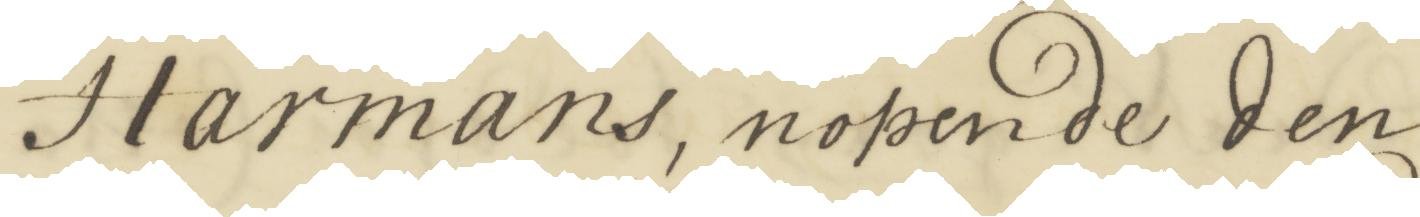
Harmans, nopende den
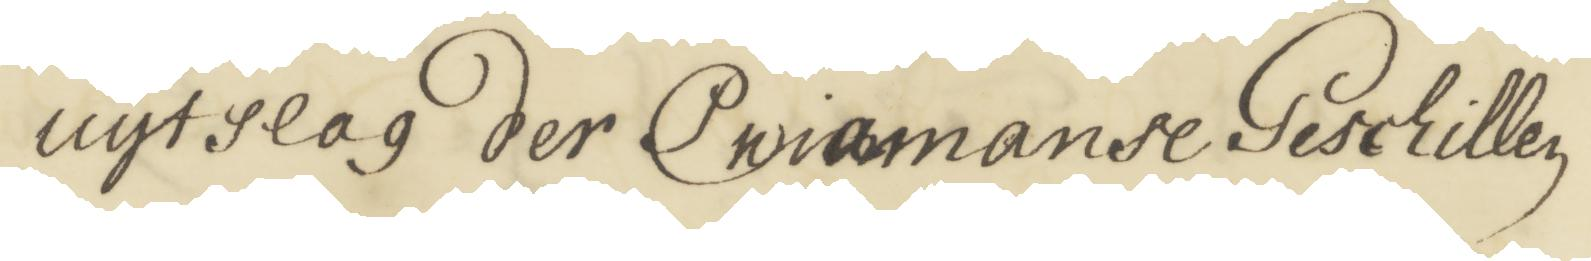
uijtslag der Priamanse Geschillen
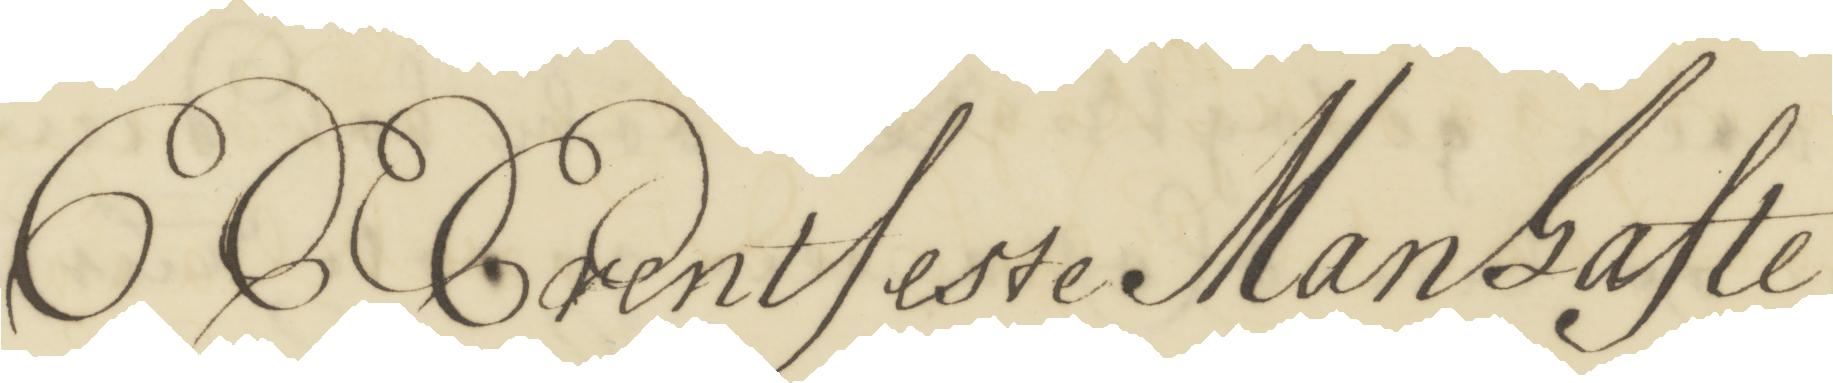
EE Erentfeste Manhafte
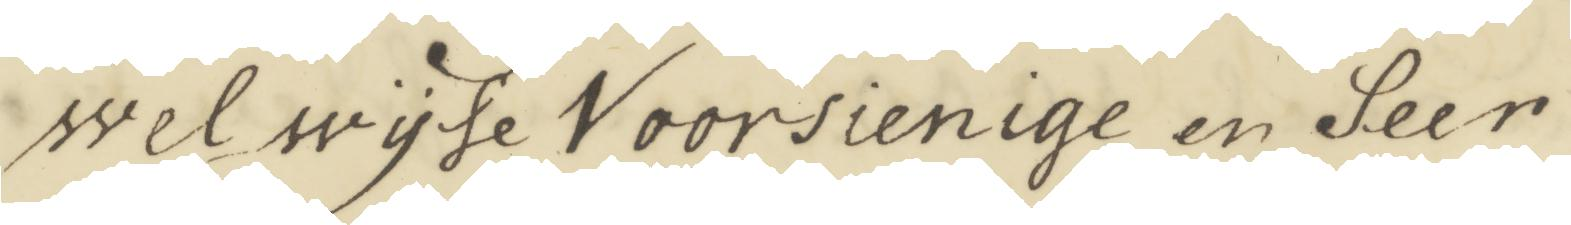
wel wijse, Voorsienige en seer
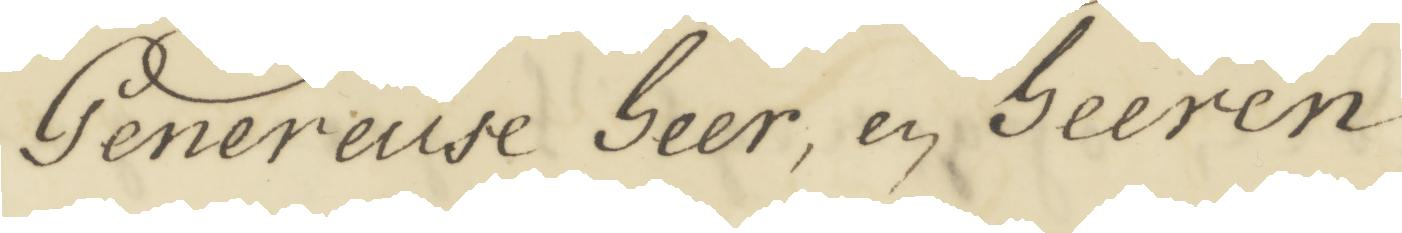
Genereuse heer, en heeren
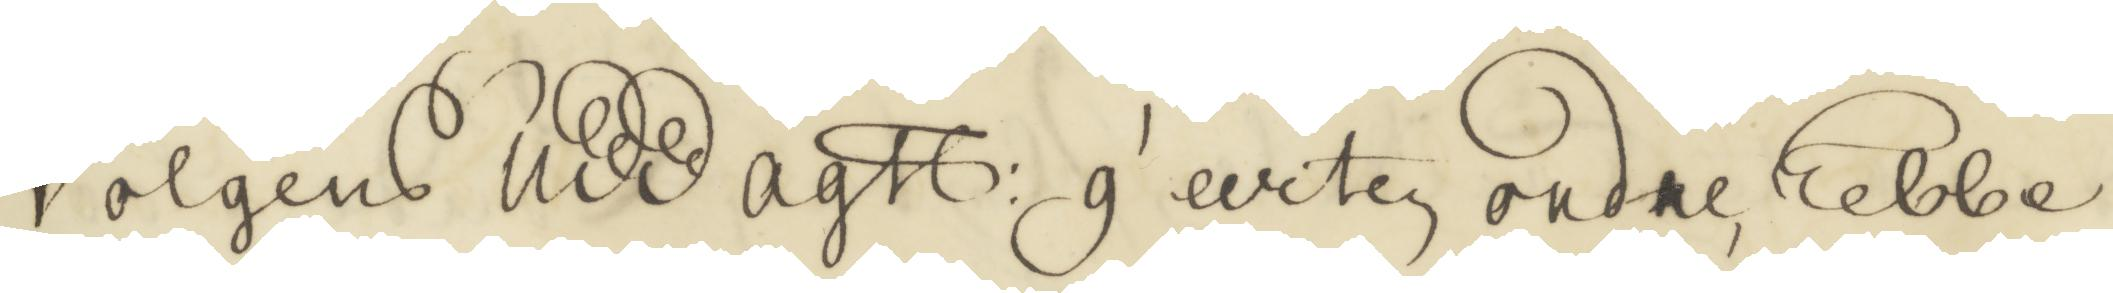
Volgens uEE agtb: g’eerten ordre, hebbe
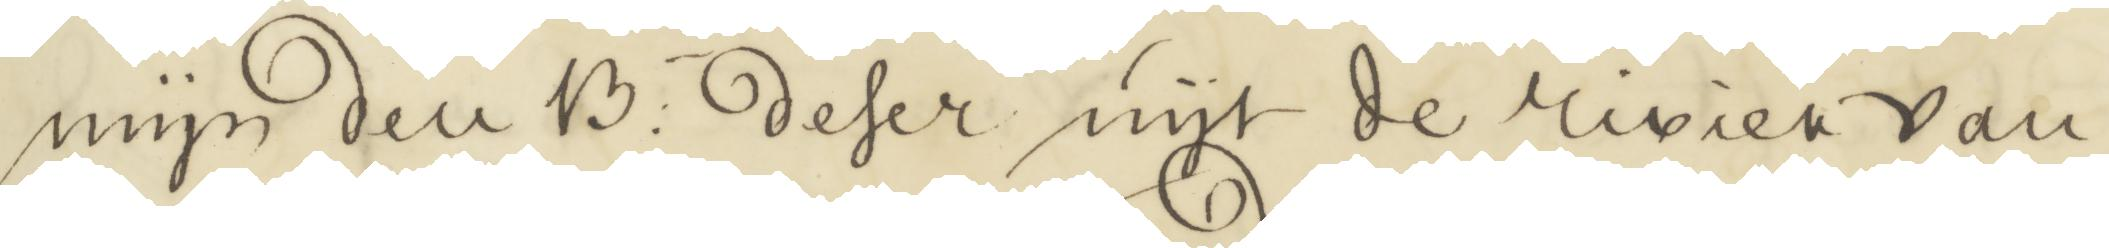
mijn den 13: deser uijt de rivier van
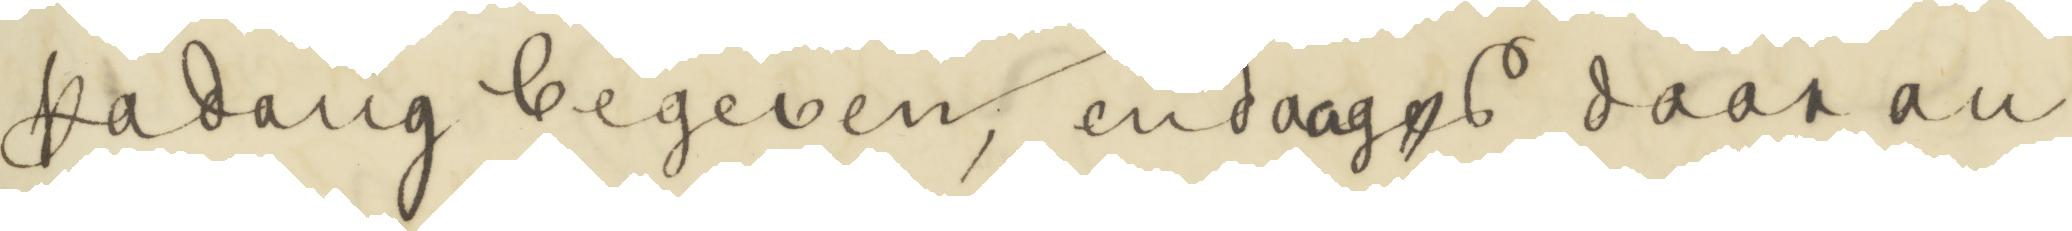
padang begeven, en daags daar an
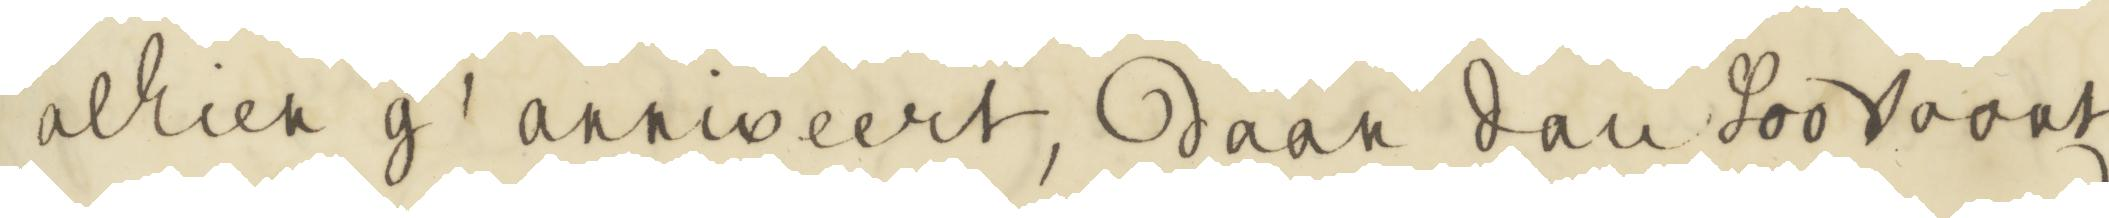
alhier g’arriveert, daar dan soo voort
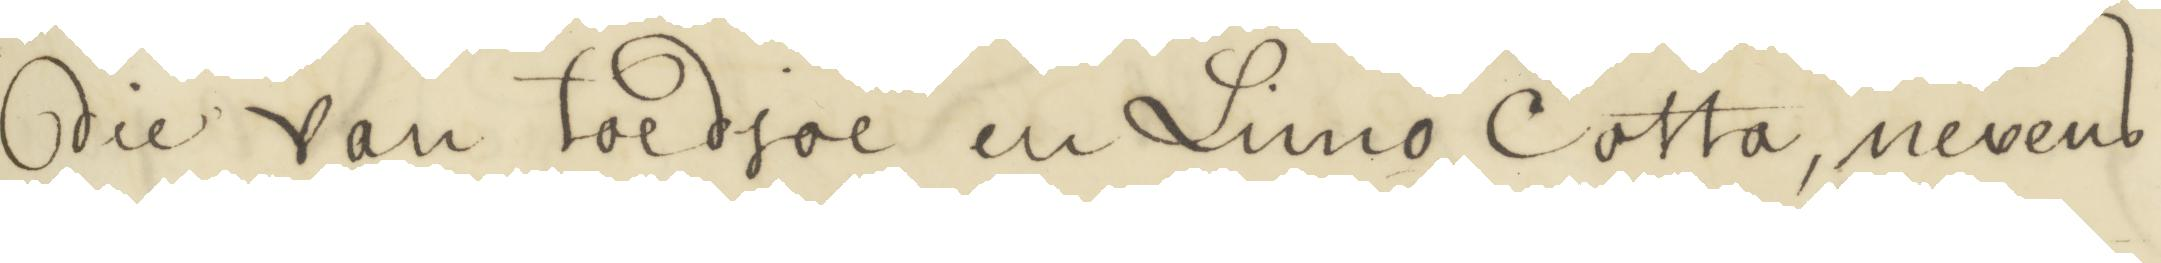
die van toedjoe en Limo Cotta, nevens
